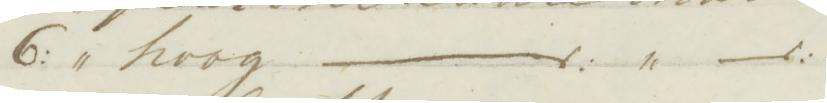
6: „ hoog _: „ _:
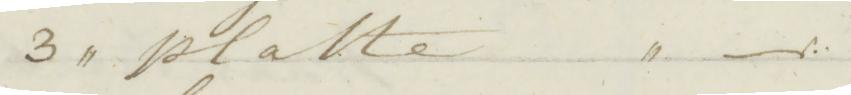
3 „ platte „ _:
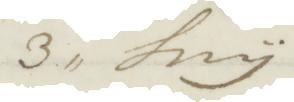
3:„ snij
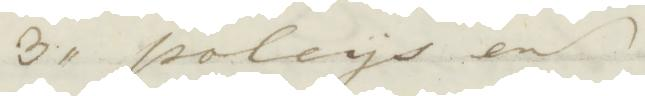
3:„ poleijs en
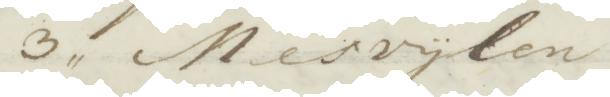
3„ Mesvijlen
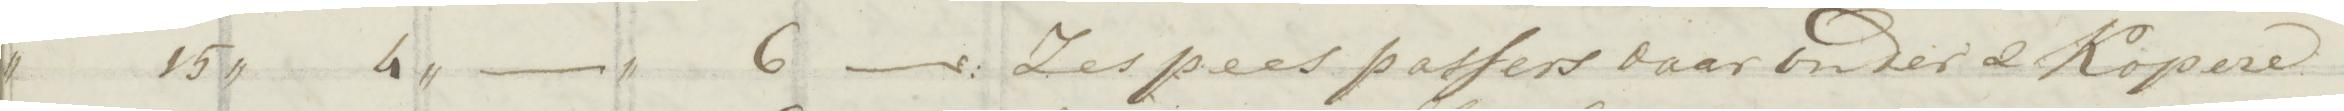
„ 15„ 4„ —„ 6 _: zes pees passers daar onder 2 Kopere
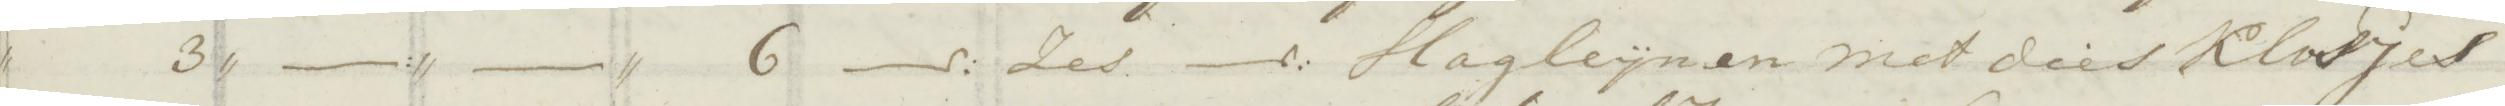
„ 3„ —:„ —„ 6 _: zes. _: slagleijnen met dies Klosjes
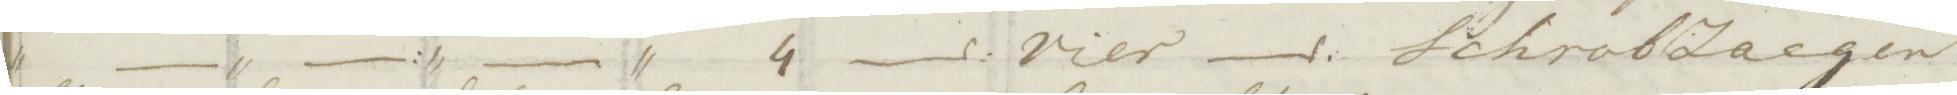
„ —„ —:„ — „ 4 _: vier _: schrobzaegen
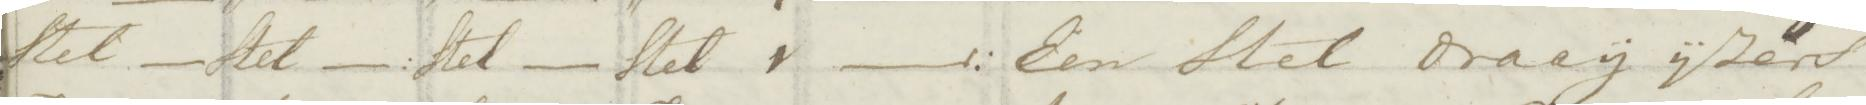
stel — stel —: stel — stel 1 _: Een stel draaij ijzers
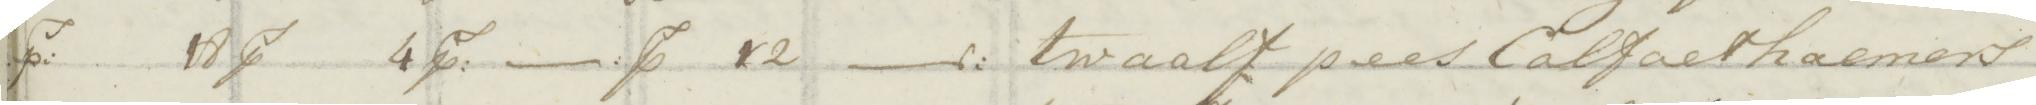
p:s 18 p:s 4 p:s — p:s 12 _: twaalf pees Calfaethaemers
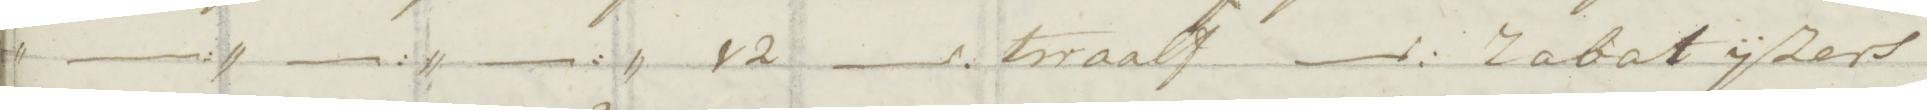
„ —:„ —:„ —:„ 12 _: twaalf _: rabat ijzers
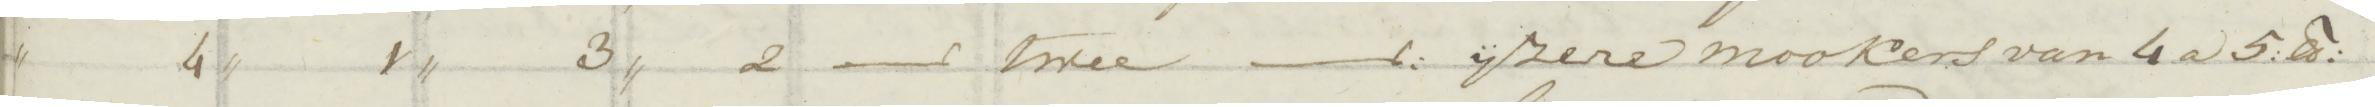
„ 4„ 1„ 3„ 2 _: twee _: ijzere mookers van 4. a 5: lb:
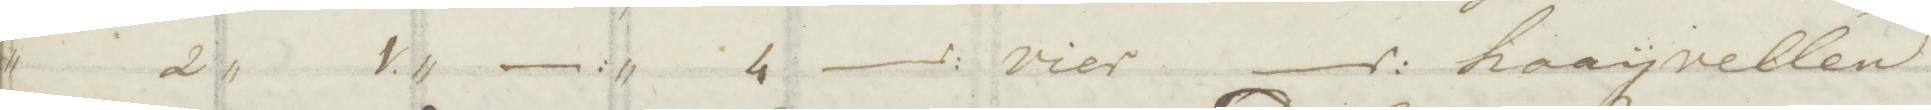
„ 2„ 1„ —:„ 4 _: vier _: haaijvellen
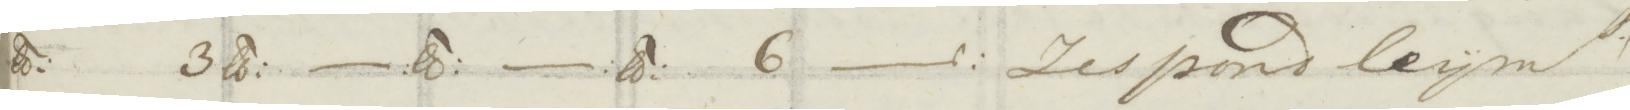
lb: 3 lb: —:lb: —:lb: 6 _: zes pond leijm
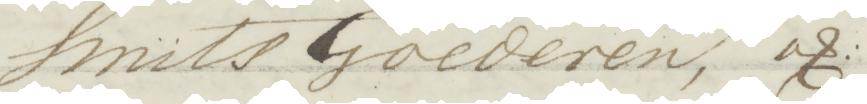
Smits Goederen, over:
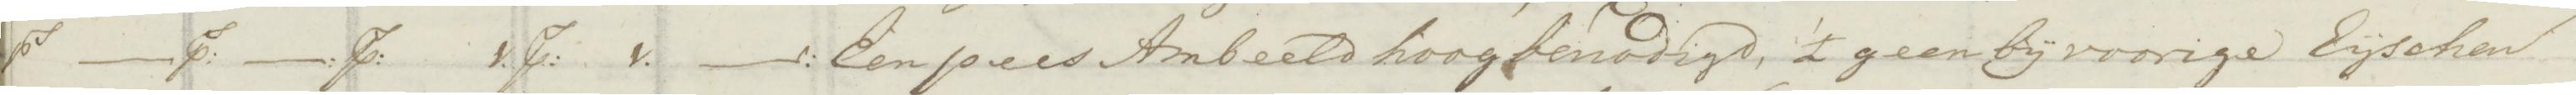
ps — p:s — p:s 1. p:s 1 _: Een pees Ambeeld hoog benodigd, ’t geen bij voorige Eijschen
